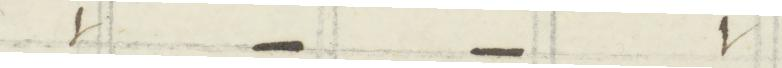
1 — — 1
